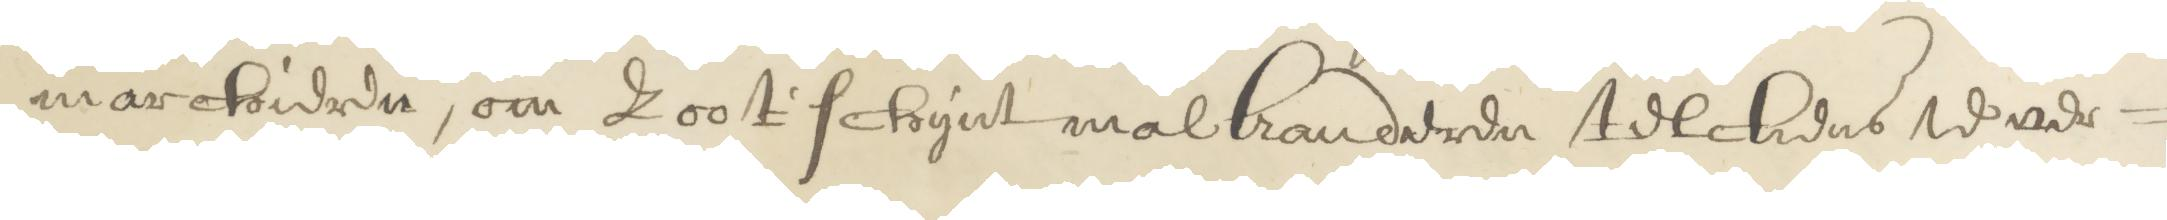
marchieren, om zoo t' schijnt malkanderen telckens te ver=
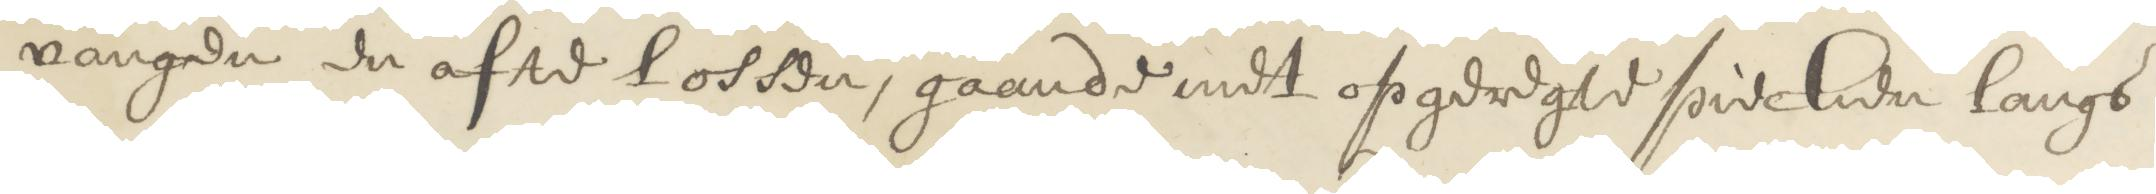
vangen en afte lossen, gaande met opgeregte piecken langs
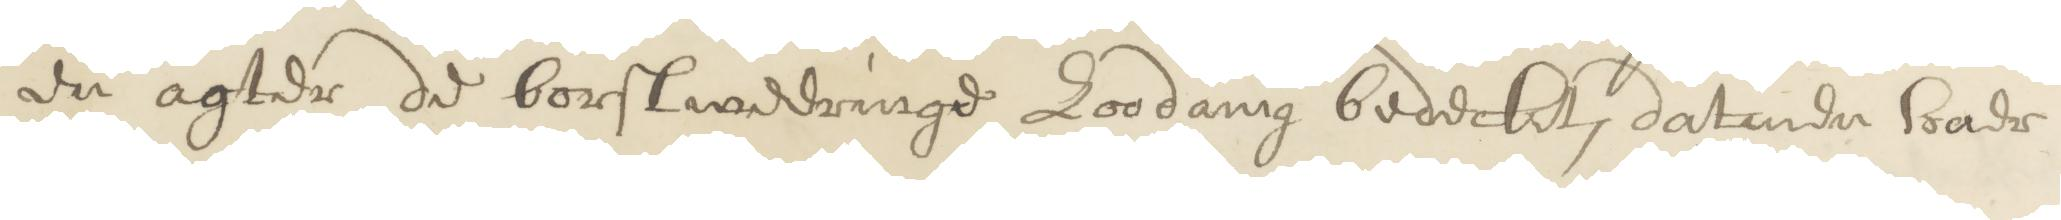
en agter de borstweeringe zoodanig bedeckt, datmen haer
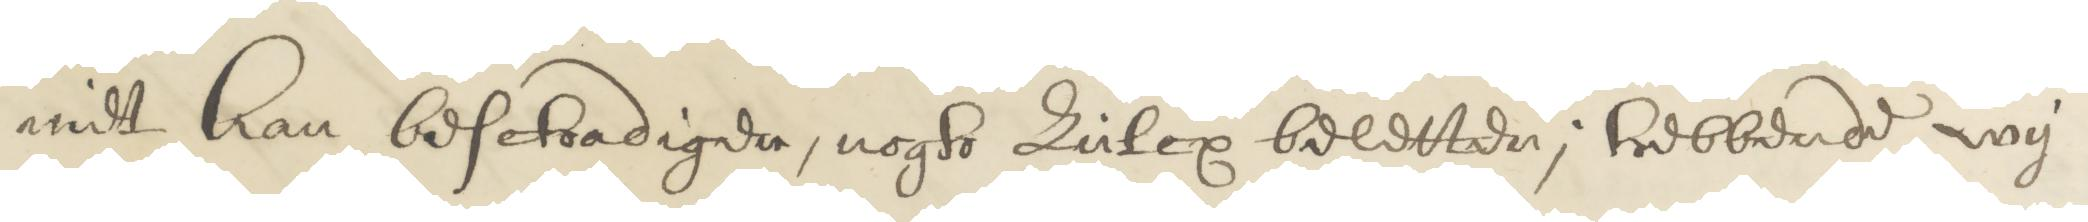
niet kan beschadigen, nogh zulcx beletten; hebbende wij
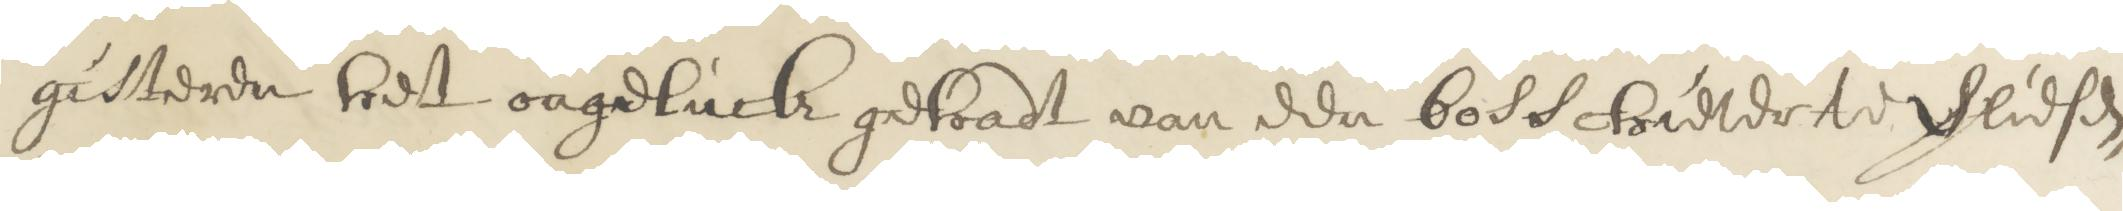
gisteren het ongeluck gehadt van een bosschieter te verliesen,
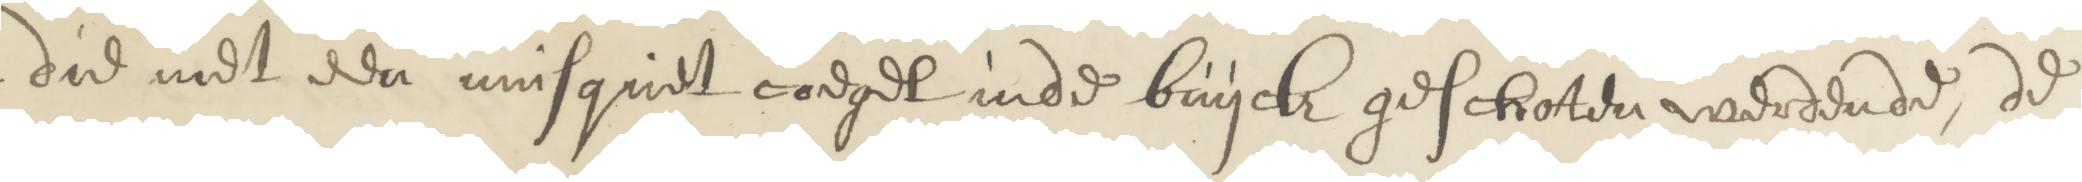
die met een musquet coegel inde buijck geschoten werdende, de
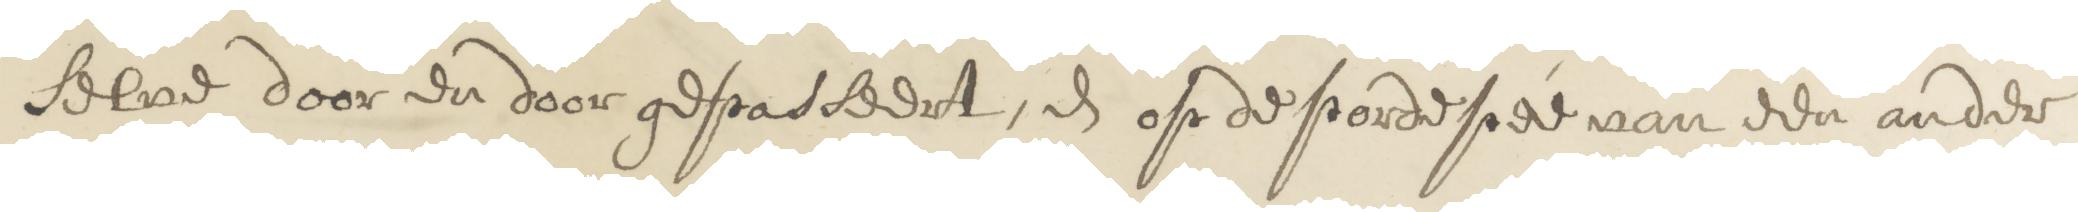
selve door en door gepasseert, en op de porde pée van een ander
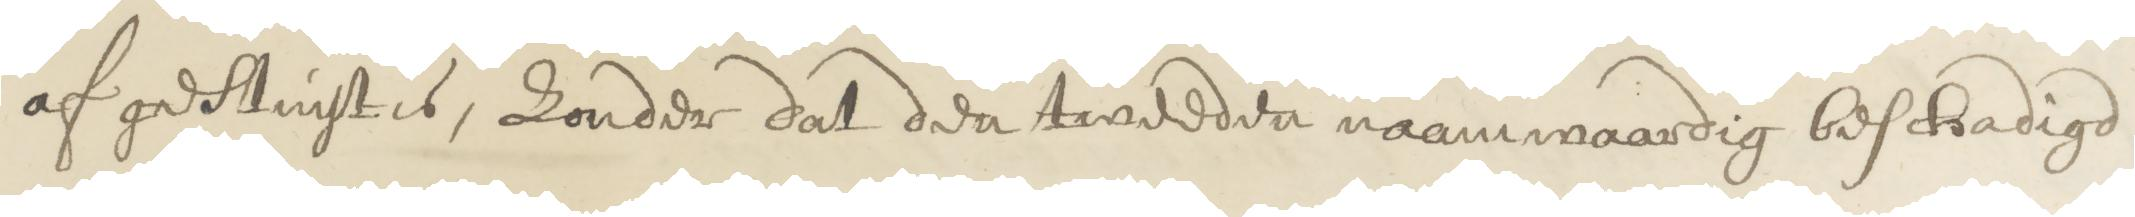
af gestuyt is, zonder dat den tweeden naamwaardig beschadigd
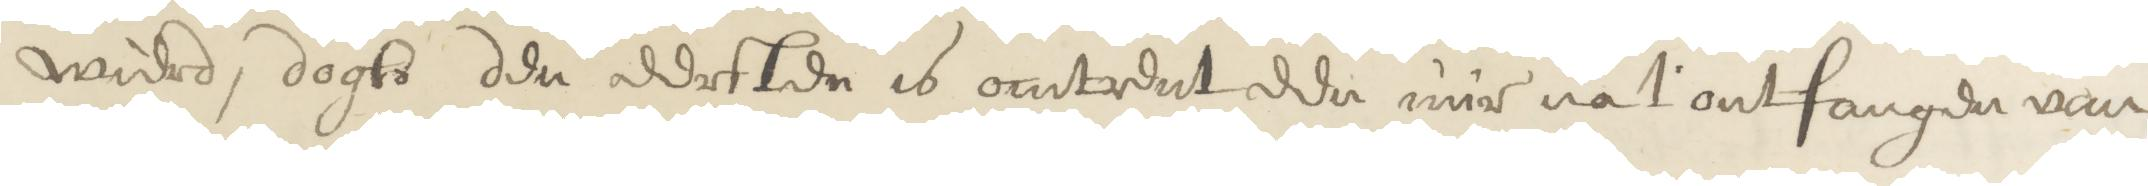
wierd, dogh den eersten is omtrent een uur na t' ontfangen van
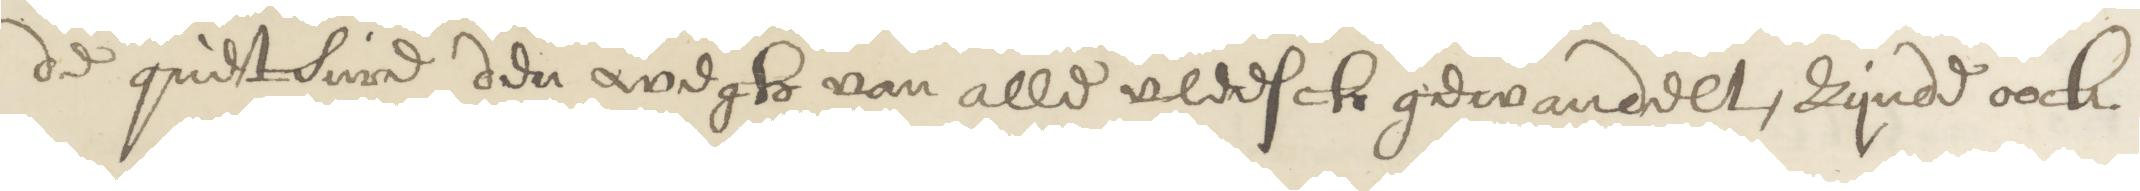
de quetsure den wegh van alle vleesch gewandelt, zijnde oock
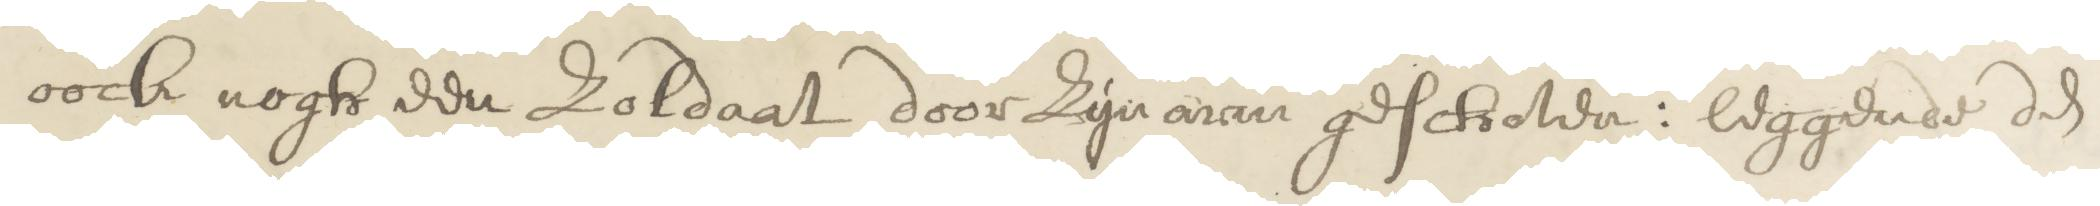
oock nogh een zoldaat door zijn arm geschoten: leggende den
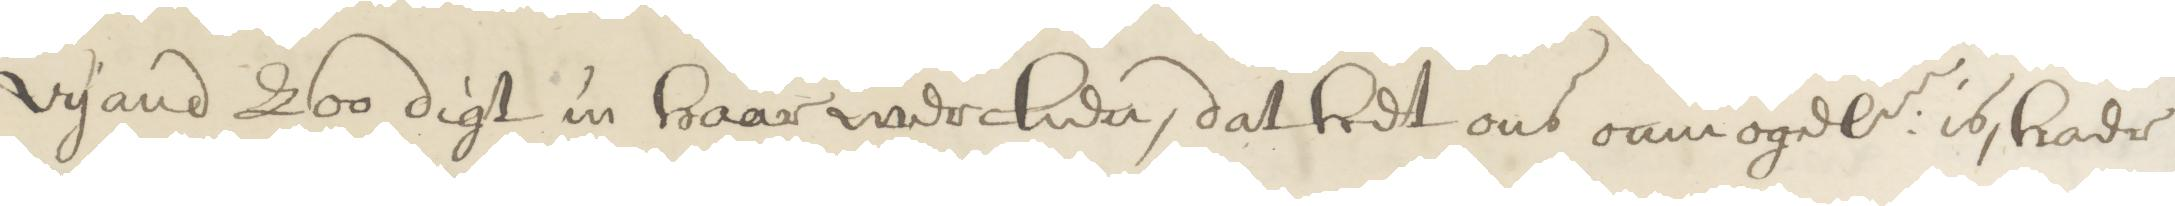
vijand zoo digt in haar wercken, dat het ons onmogel: is, haer
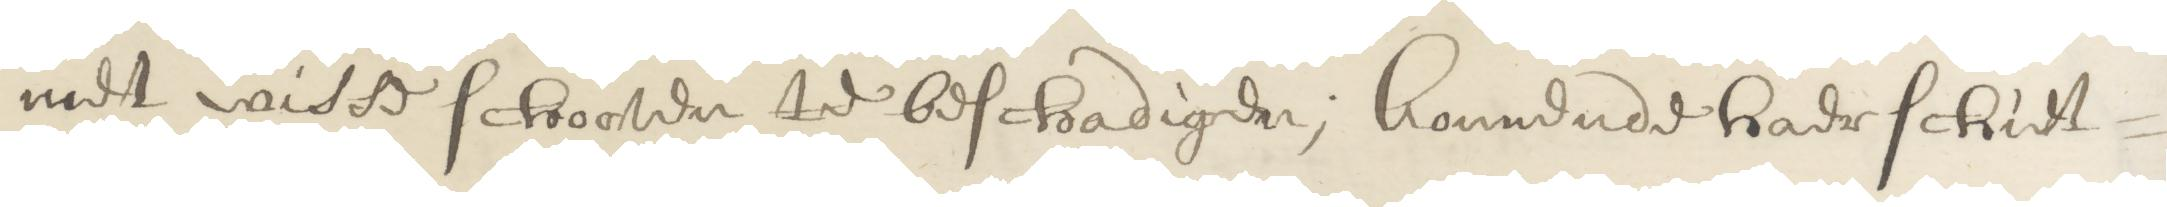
niet wisse schooten te beschadigen; konnende haer schiet
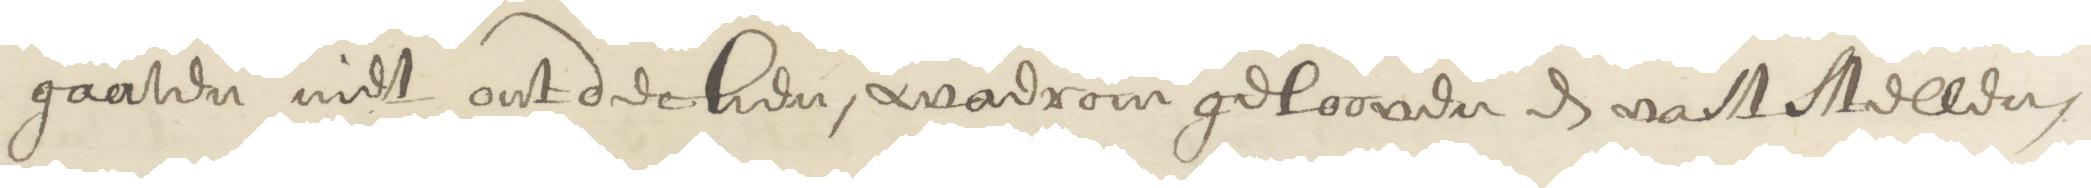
gaaten niet ontdecken, waerom gelooven en vast stellen,
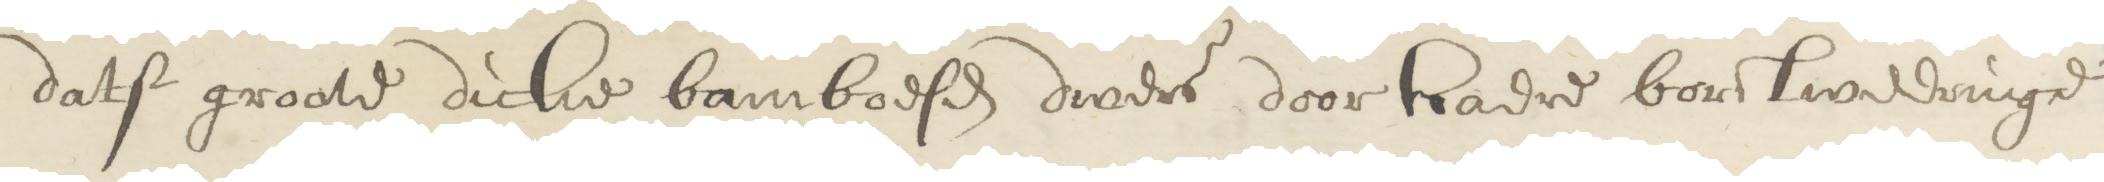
dats groote dicke bamboesen dwars door haere borstweeringe
